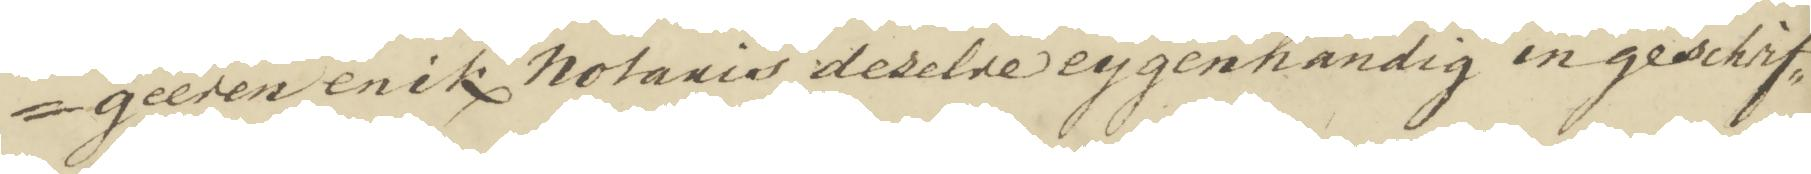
=geeven en ik Notaris dezelve eijgenhandig in geschrif„
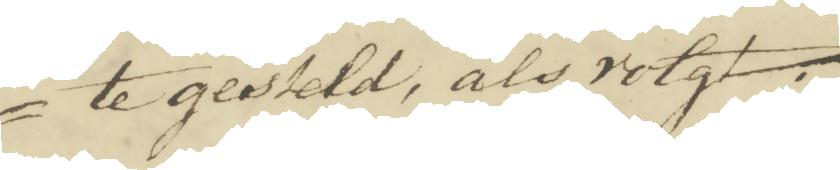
=te gesteld, als volgt.
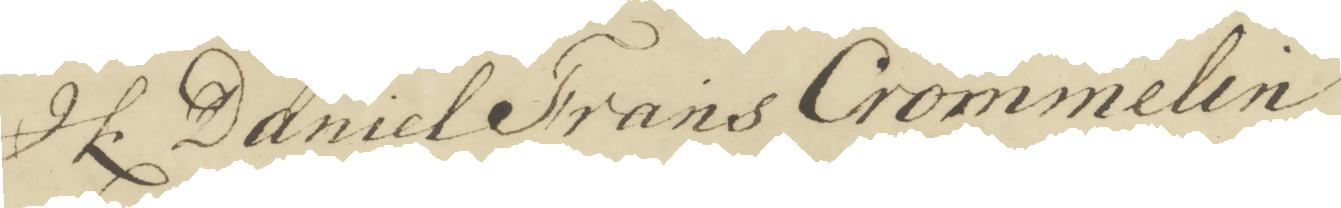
Ik Daniel Frans Crommelin
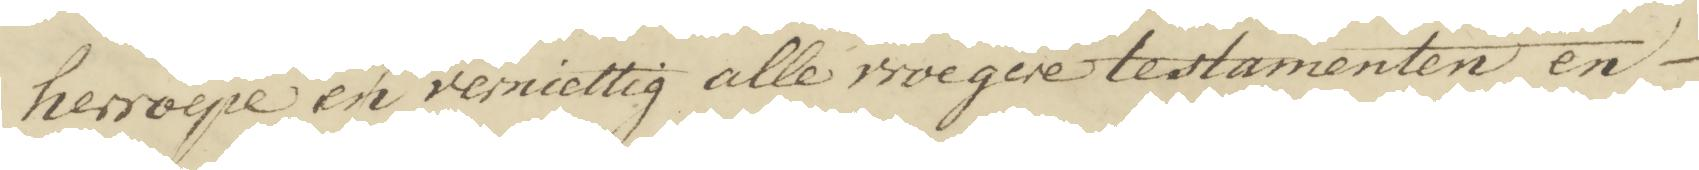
herroepe en verniettig alle vroegere testamenten en —
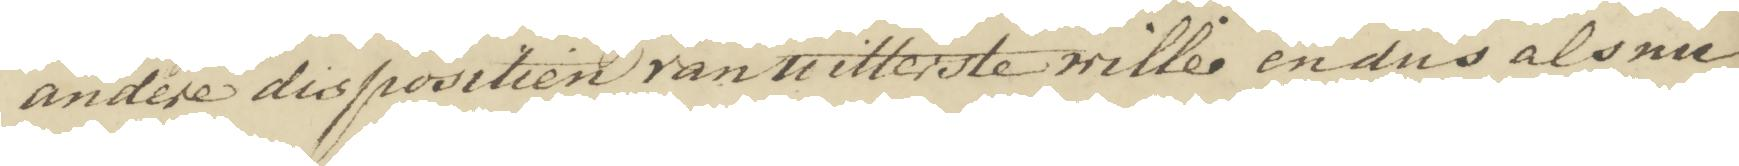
andere dispositien van uitterste wille en dus als nu
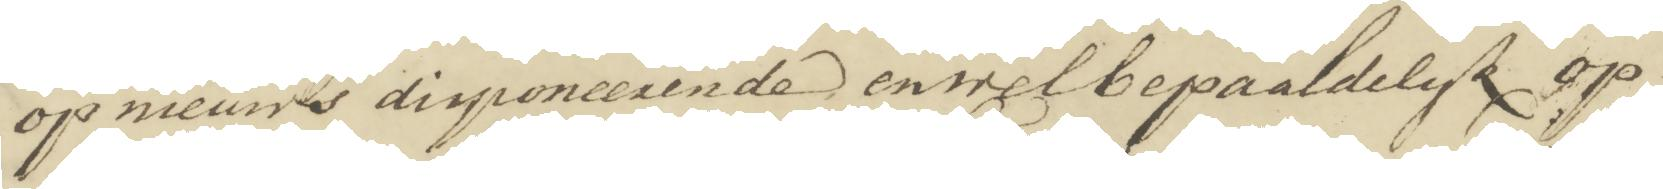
op nieuws disponeerende en wel bepaaldelyk op
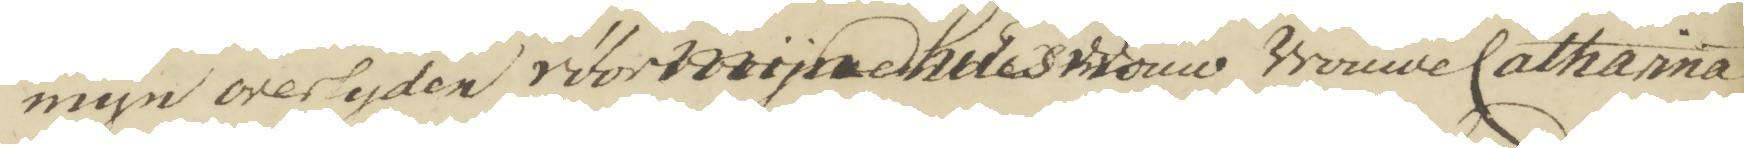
myn overlyden voor mijne huisvrouw Vrouwe Catharina
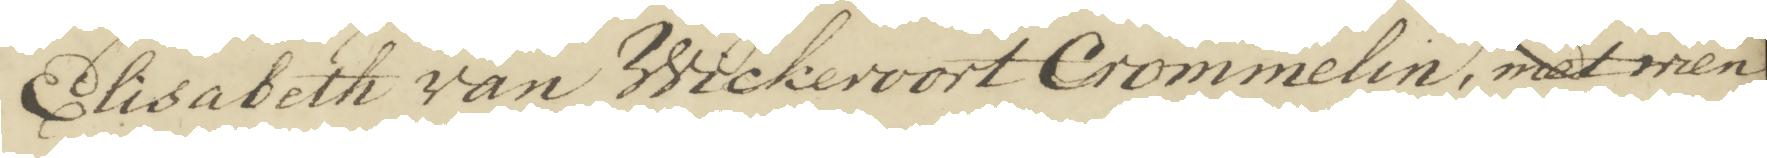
Elisabeth van Wickevoort Crommelin, met wien
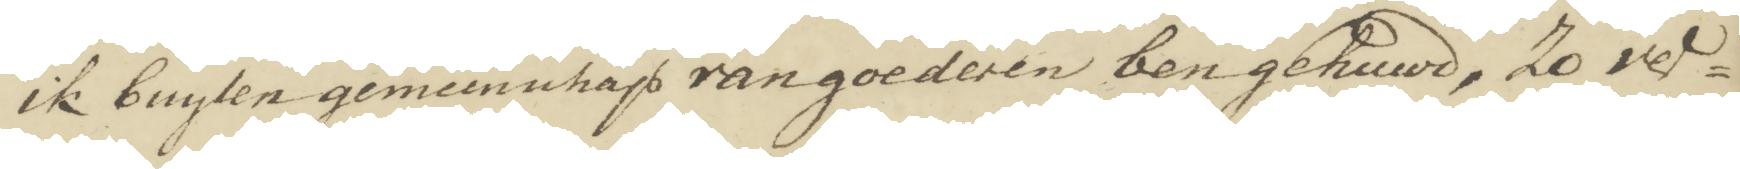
ik buyten gemeenchap van goederen ben gehuwd, zo ver=
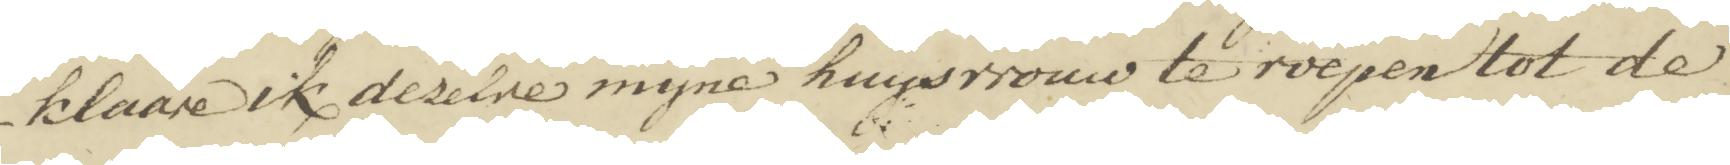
klaare ik dezelve myne huysvrouw te roepen tot de
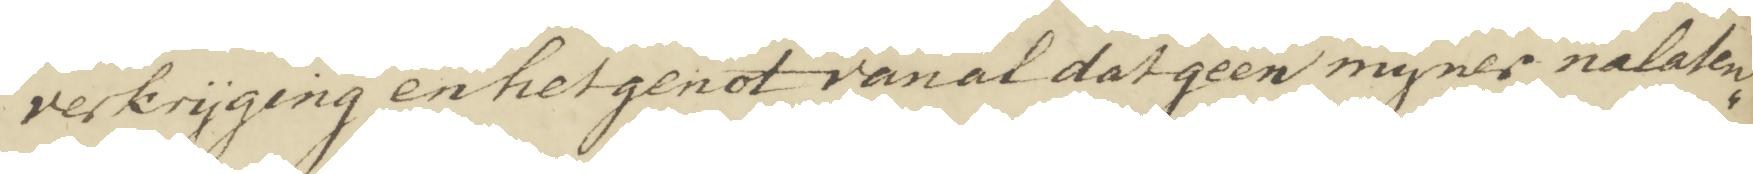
verkrijging en het genot vanal datgeen myner nalaten„
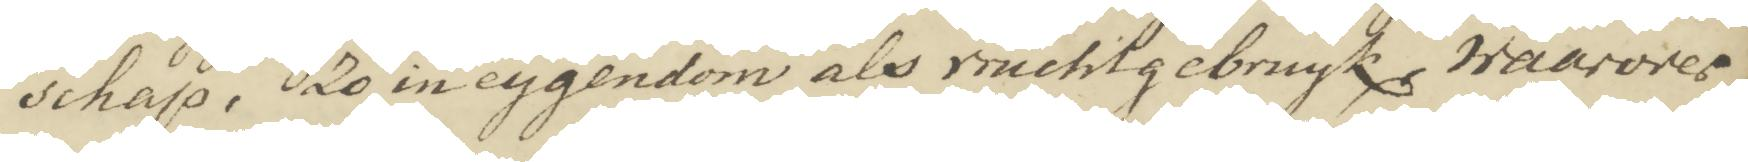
schap, zo in eygendom als vruchtgebruyk, waarover
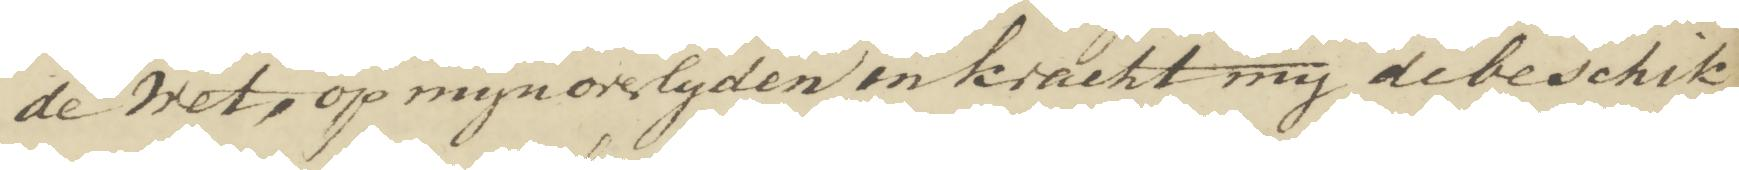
de wet, op mijn overlyden in kracht mij debeschik
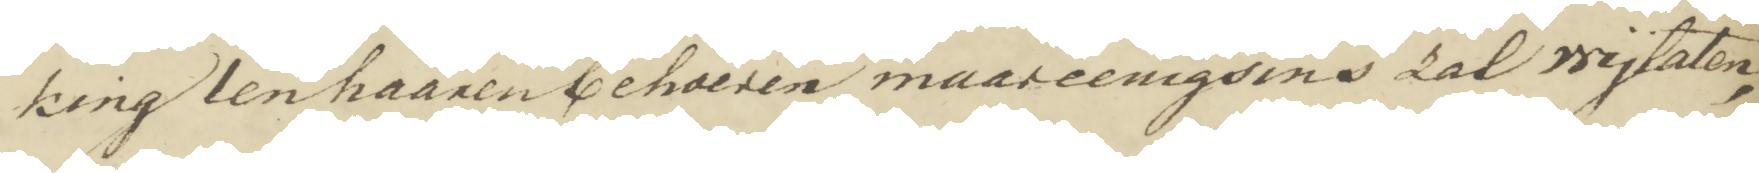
king ten haaren behoeven maar eenigsins zal vrijlaten
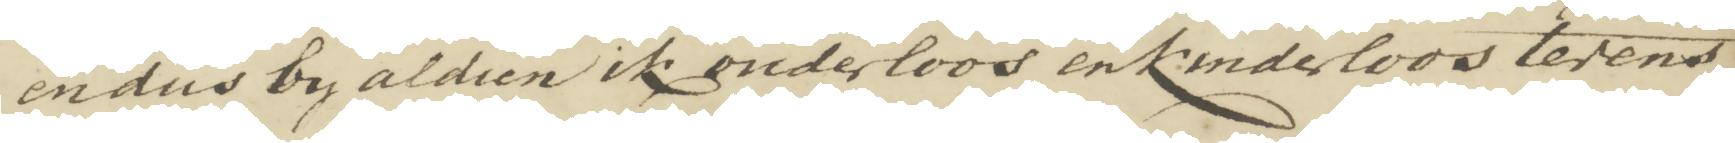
en dus by aldien ik ouderloos en kinderloos tevens
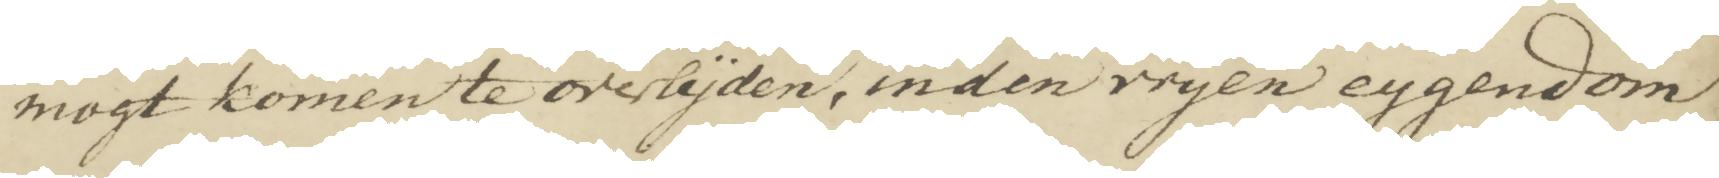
mogt komen te overlijden, inden vryen eygendom
